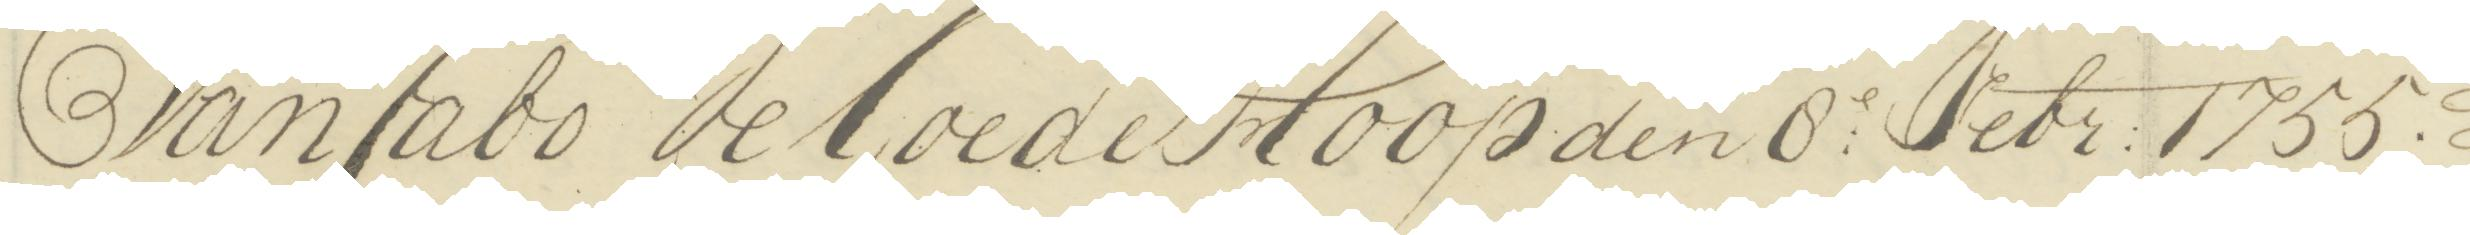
Van Cabo de Goede Hoop den 8:e Febr: 1755.
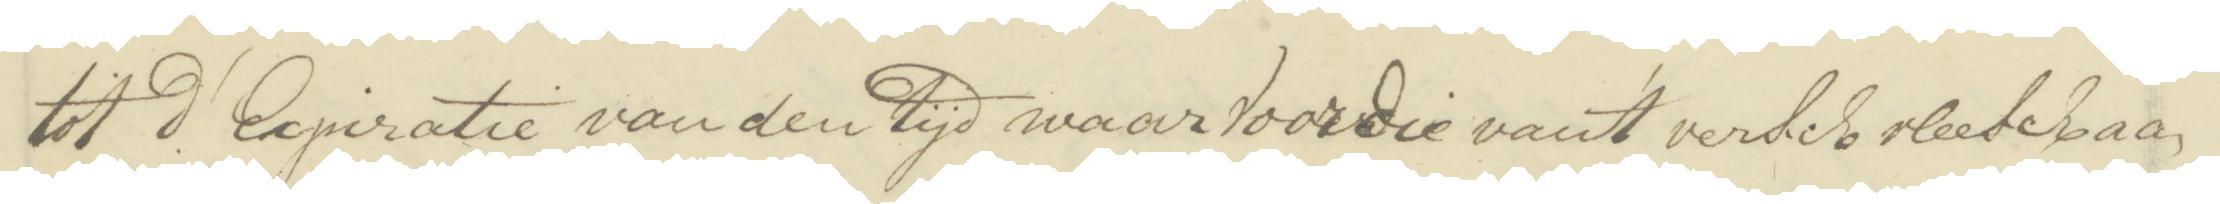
tot d’Expiratie van den tijd waar voor die van’t versch vleesch aan
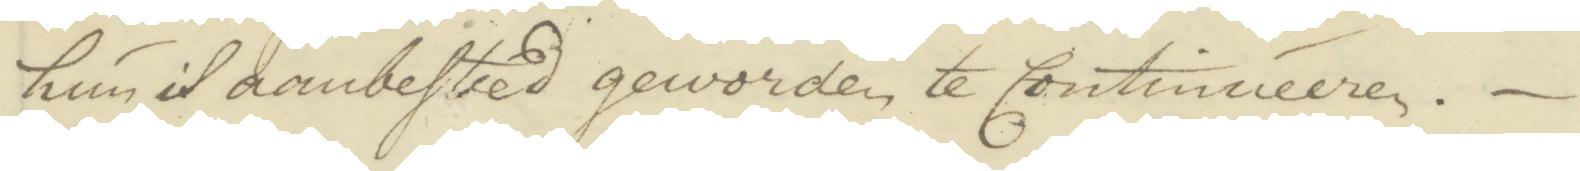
hun is aanbesteed geworden te continueeren. —
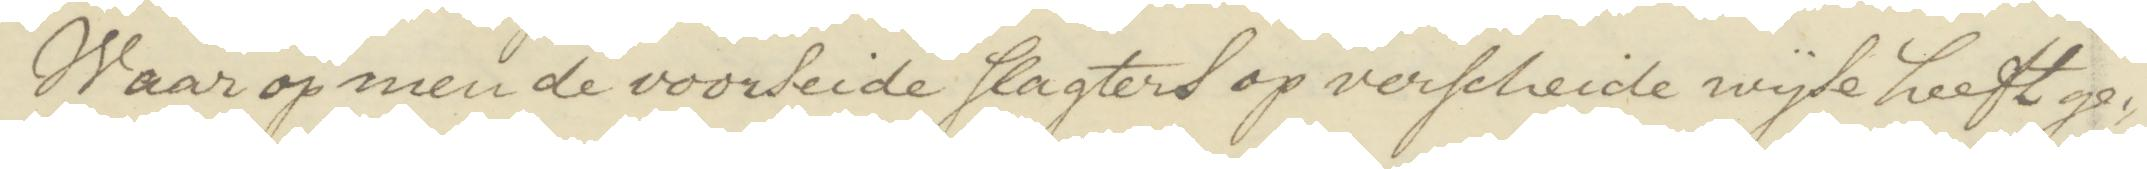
Waar op men de voorseide slagters op verscheide wijse heeft ge„
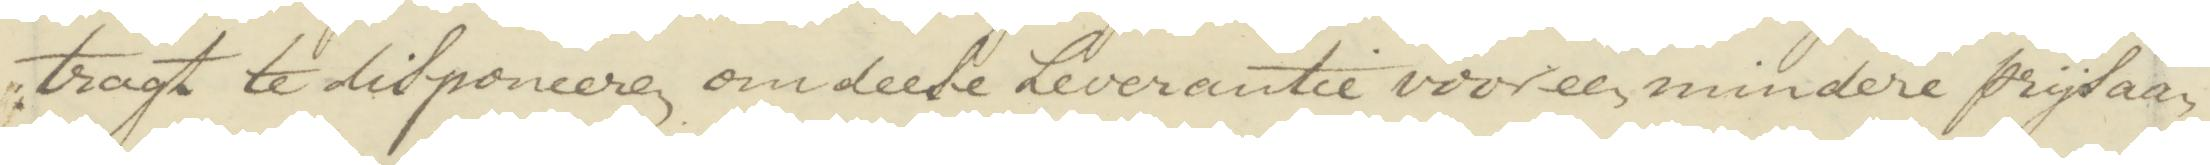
„tragt te disponeeren om deese Leverantie voor een mindere prijs aan
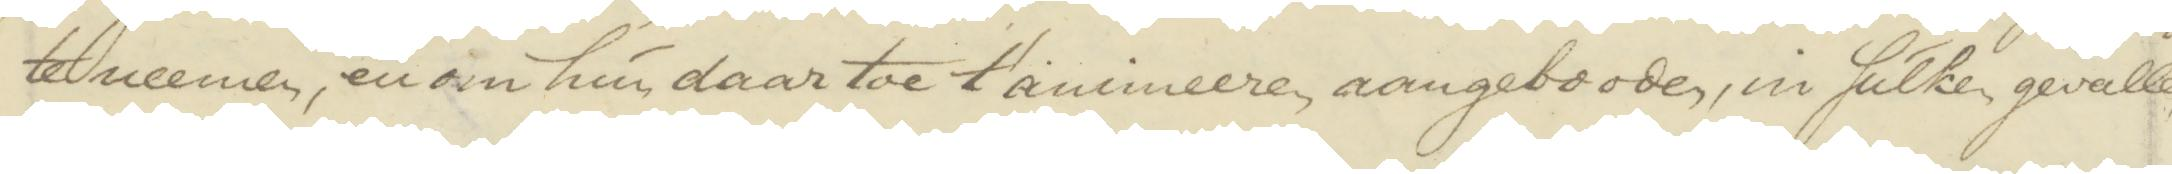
te neemen, en om hun daar toe t'animeeren aangebooden, in sulken gevallen
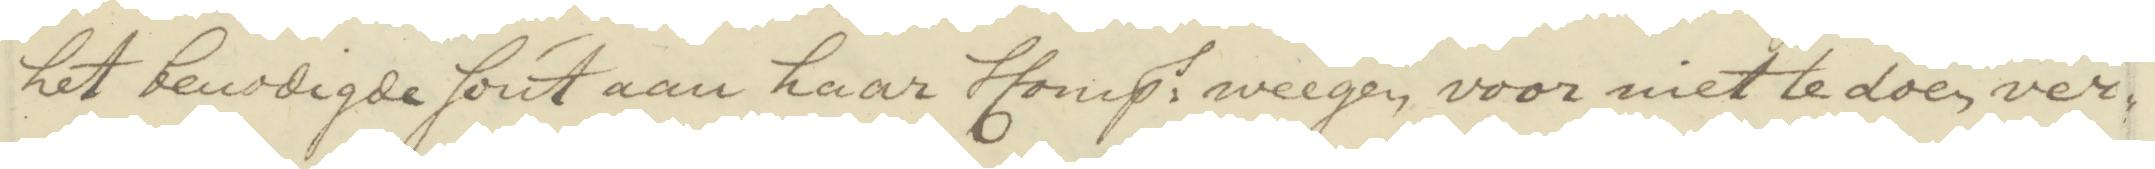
het benodigde sout aan haar sComp:s weegen voor niet te doen ver„
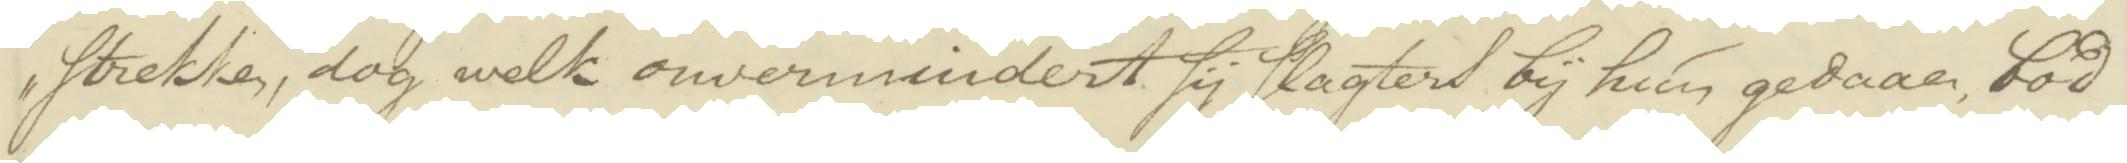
„strekken, dog welk onvermindert sij slagters bij hun gedaaen bod
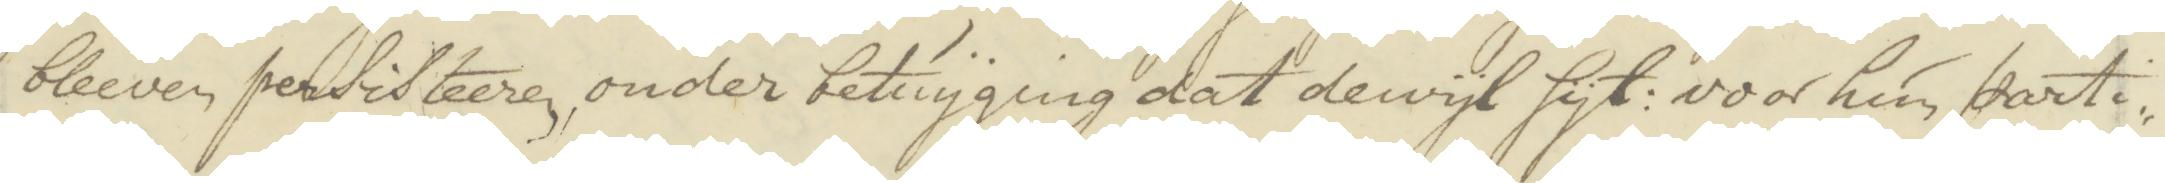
bleeven persisteeren, onder betuijging dat dewijl sijl: voor hun parti„
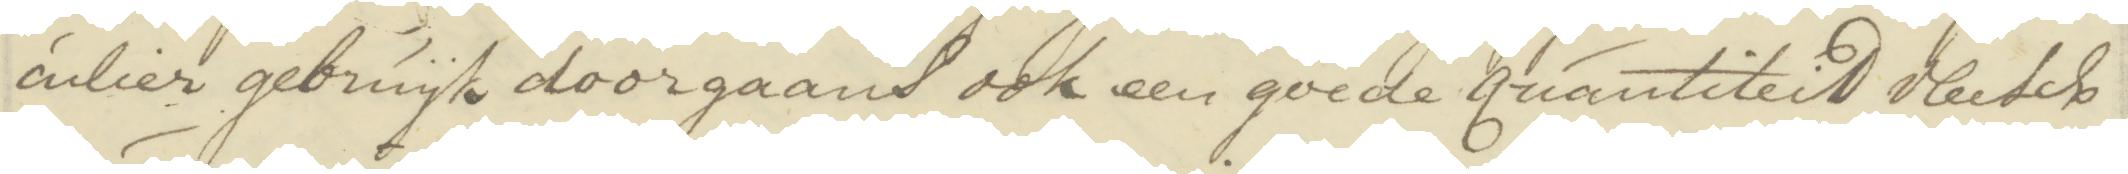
culier gebruijk doorgaans ook een goede quantiteid vleesch
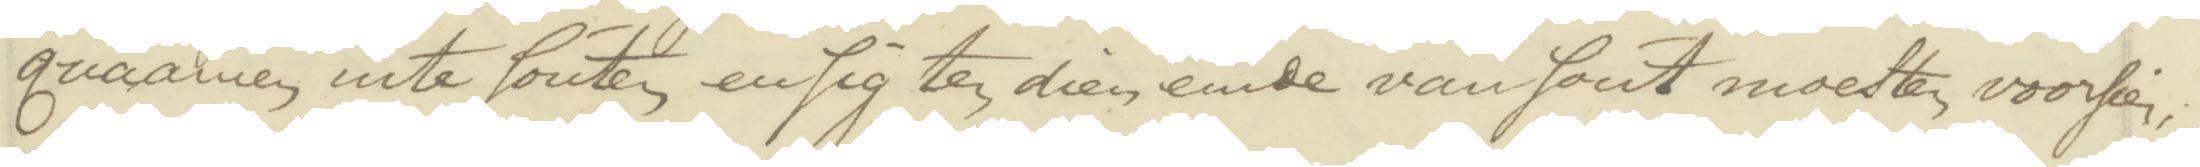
quaamen inte souten en sig ten dien einde van sout moesten voorsien,
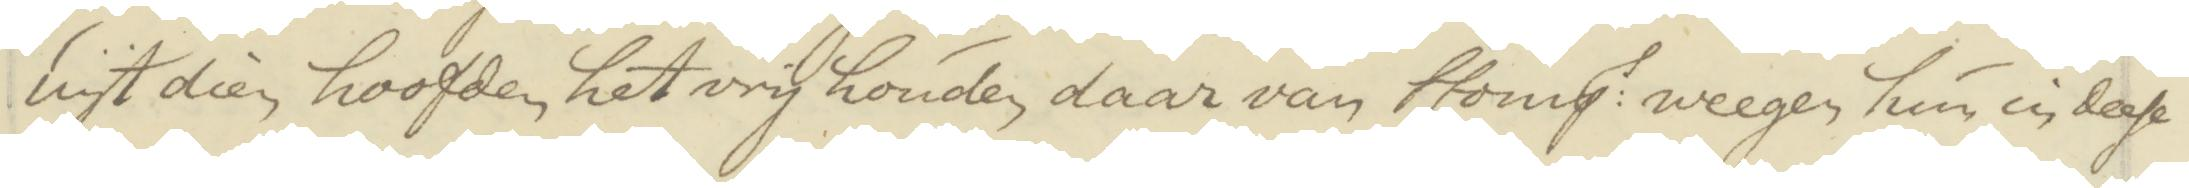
uijt dien hoofden het vrij houden daar van sComp:s weegen hun in deese
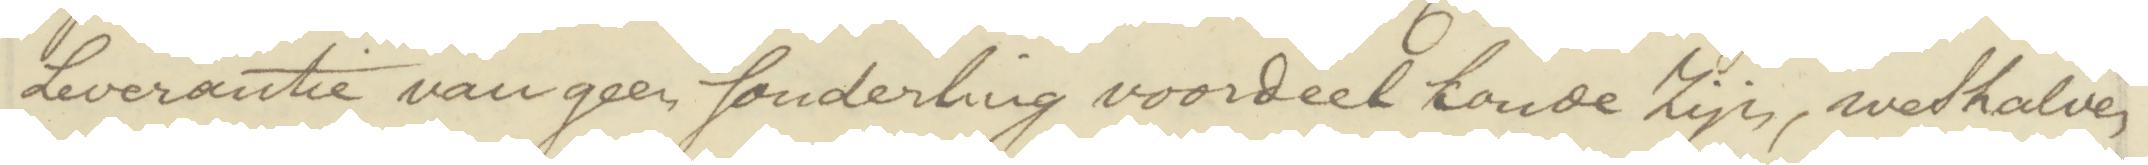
Leverantie van geen sonderling voordeel konde zijn, weshalven
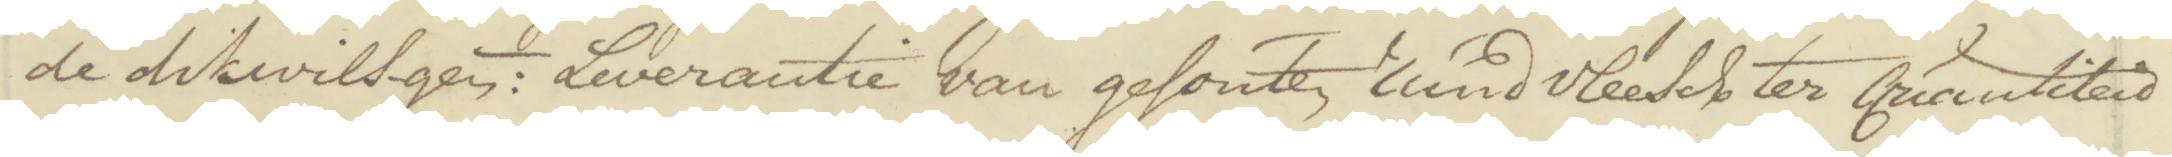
de dikwils gen: Leverantie van gesouten rund vleesch ter quantiteid
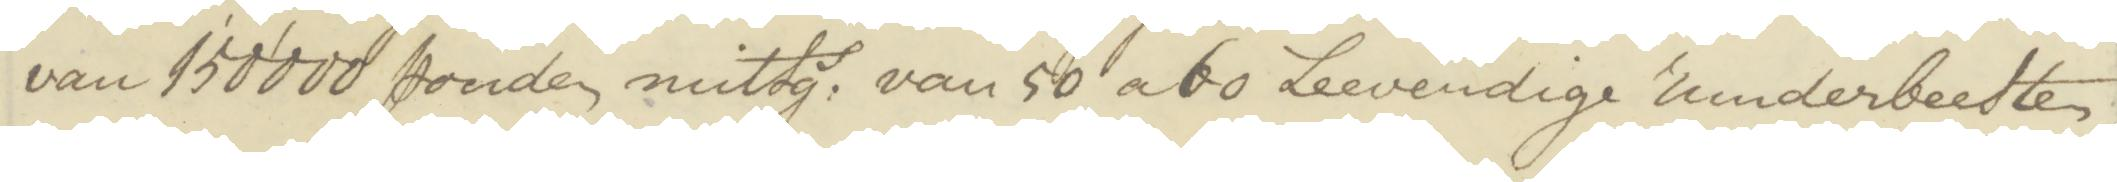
van 150'000 ponden mitsg:s van 50 a 60 Leevendige runderbeesten
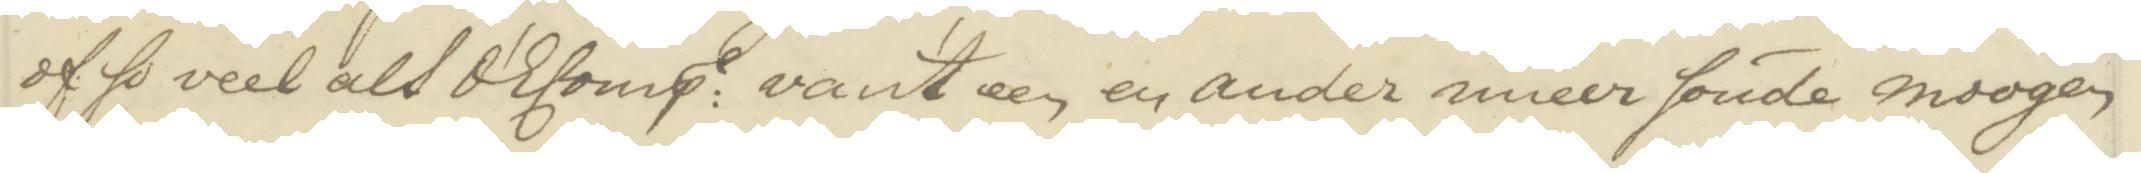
of so veel als d'EComp:e van’t een en ander meer soude moogen
